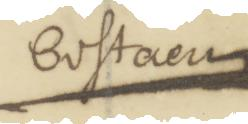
bestaen
